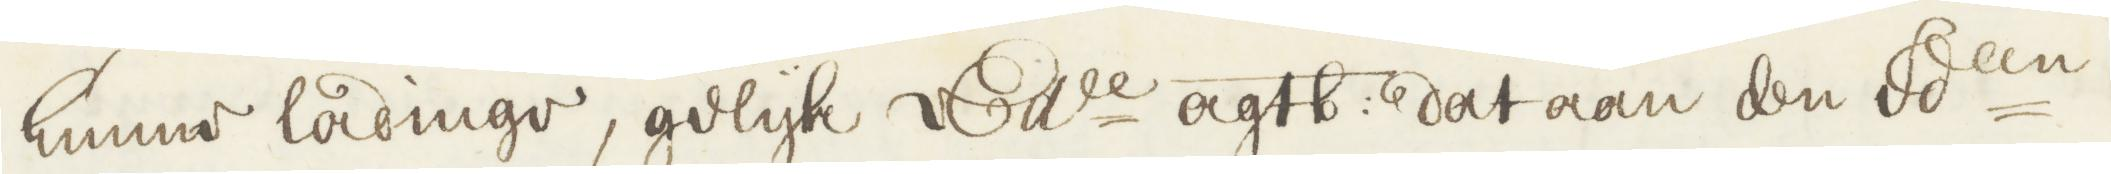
hunne ladinge, gelijk uEd=le agtb:e dat aan den Ed=len
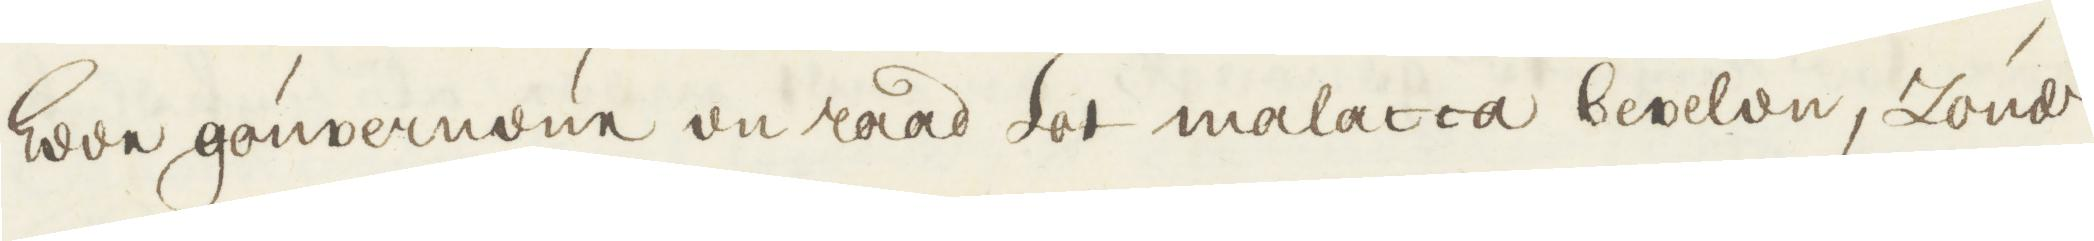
heer gouverneur en raad tot malacca bevelen, zoude
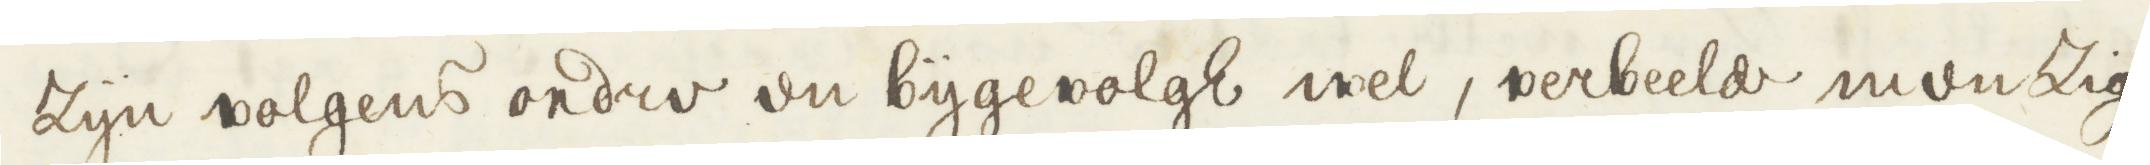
zijn volgens ordre en bijgevolgh wel, verbeelde men zig
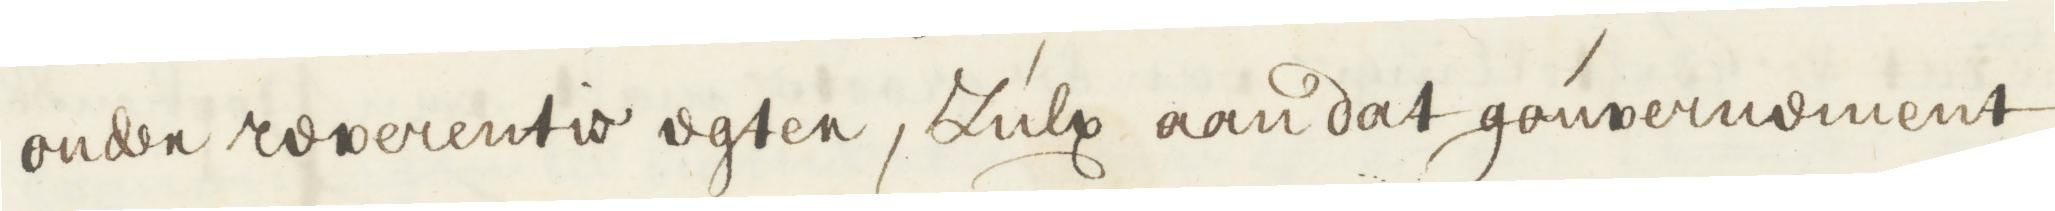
onder reverentie egter, zulx aan dat gouvernement
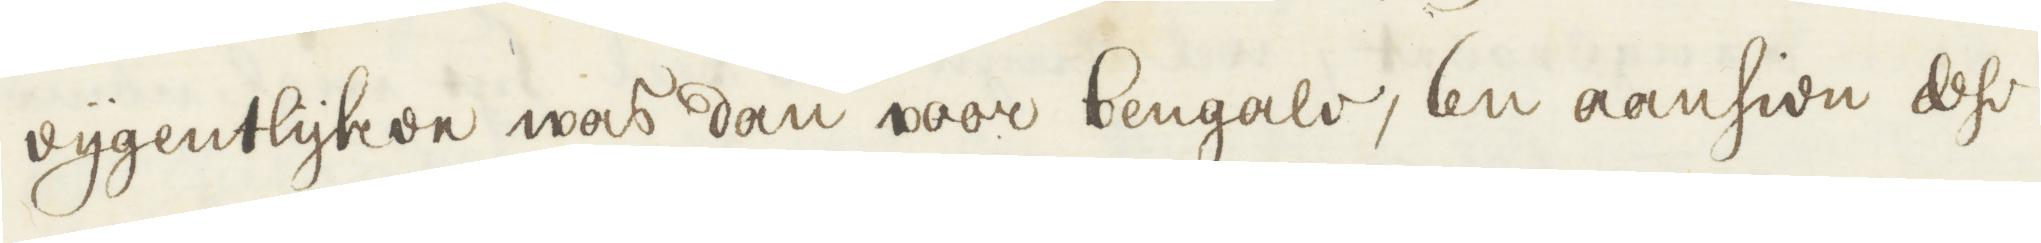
eijgentlijker was dan voor bengale, ten aansien dese
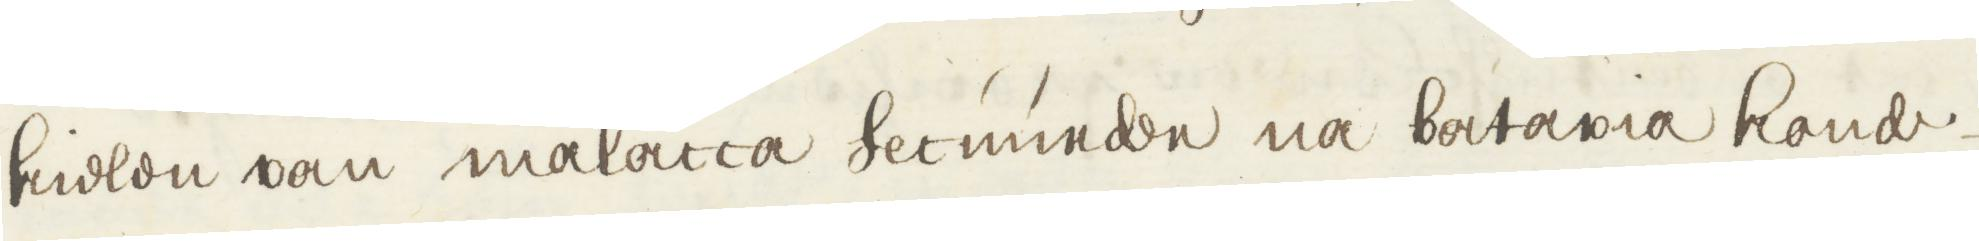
kielen van malacca secuurder na batavia konde
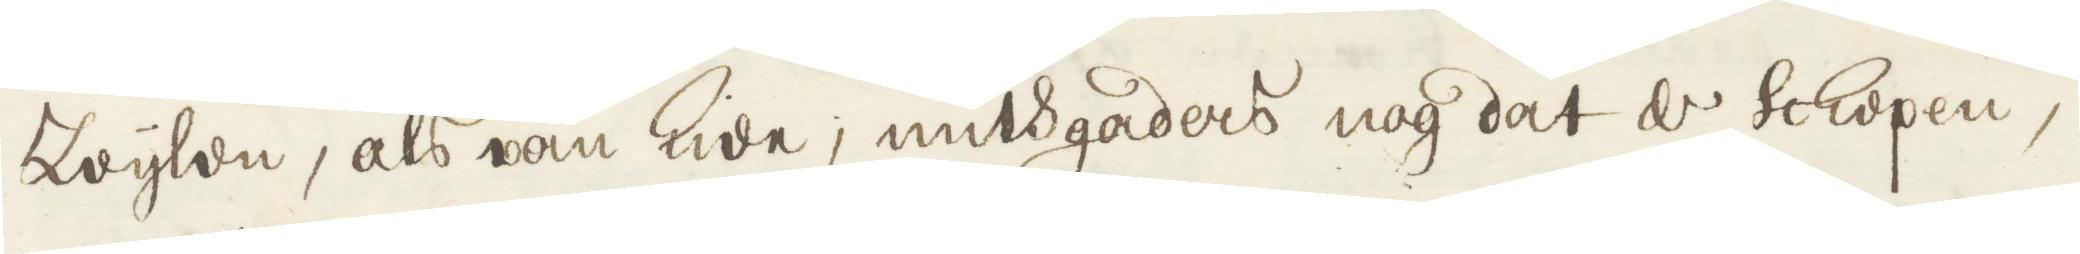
zeijlen, als van hier; mitsgaders nog dat de schepen,
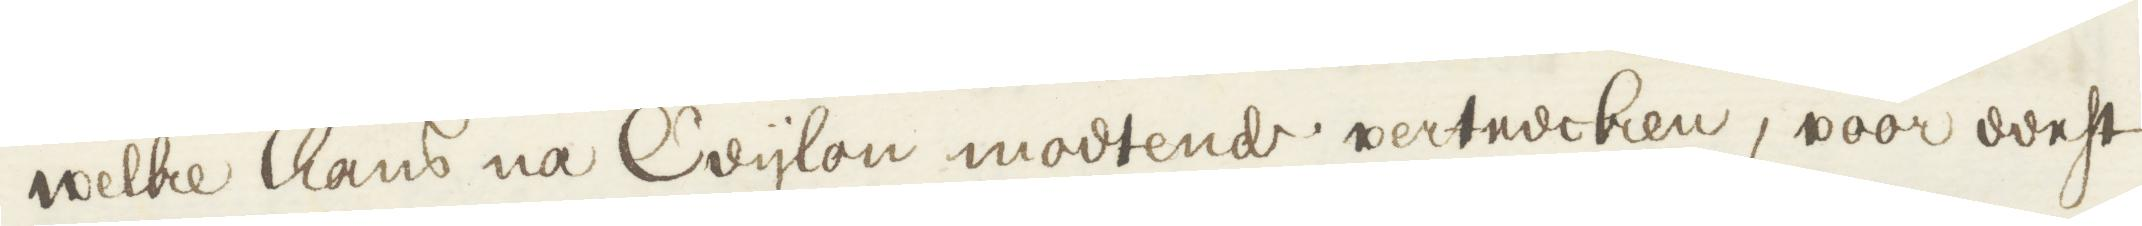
welke thans na Ceijlon moetende vertrecken, voor eerst
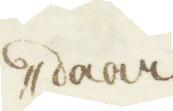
„daar
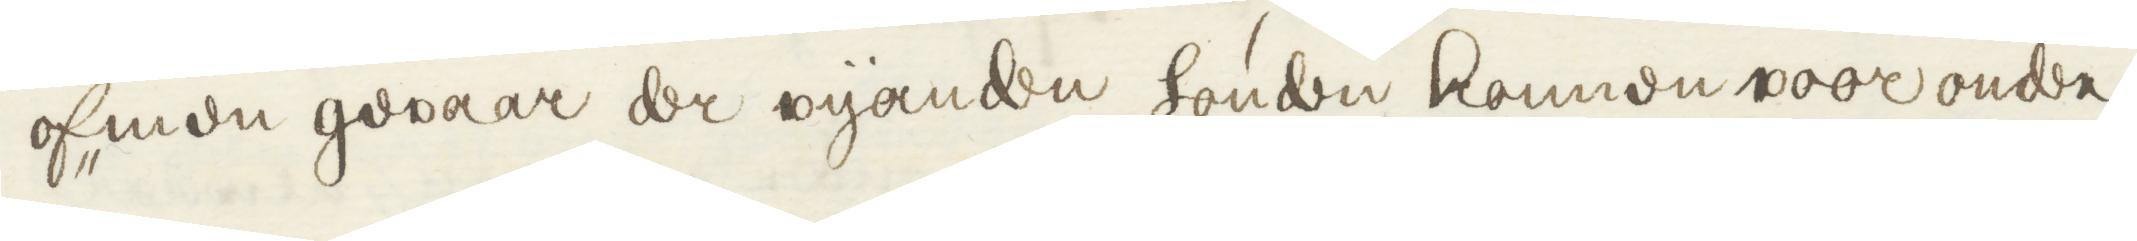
of„ men gevaar der vijanden souden konnen voor onder
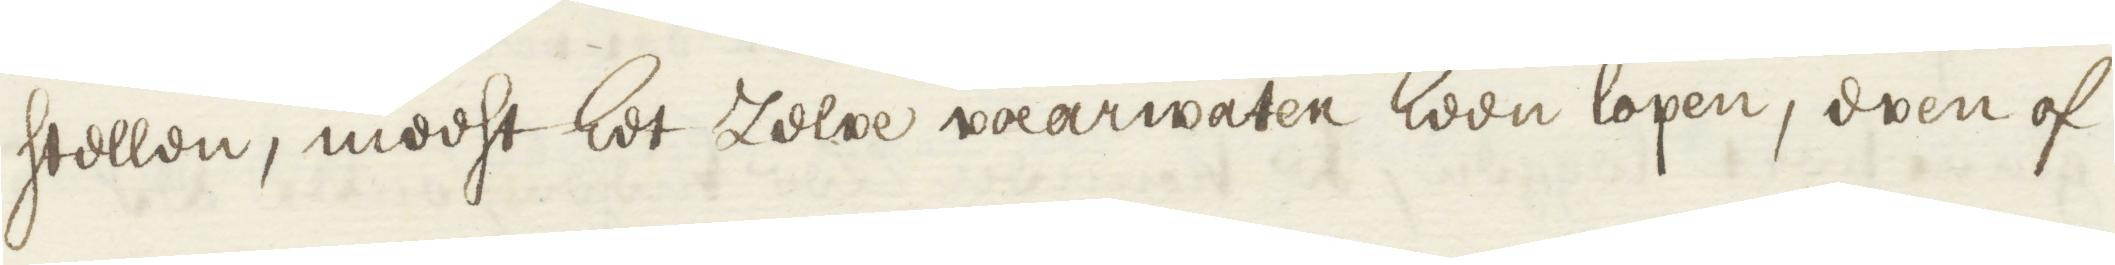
stellen, meest het zelve vaarwater heen lopen, even of
